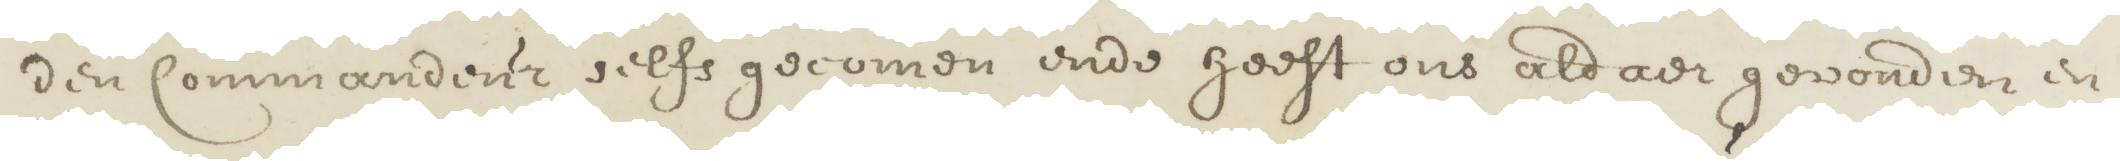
den commandeur selfs gecomen ende heeft ons aldaer gevonden en
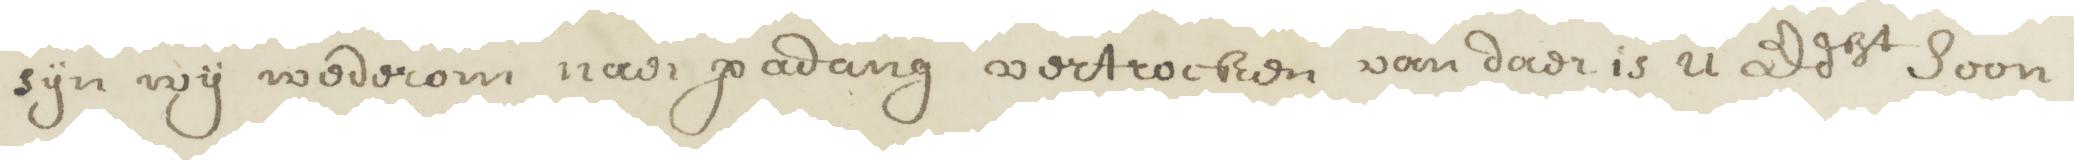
sijn wij wederom naer padang vertrocken van daer is u Edht soon
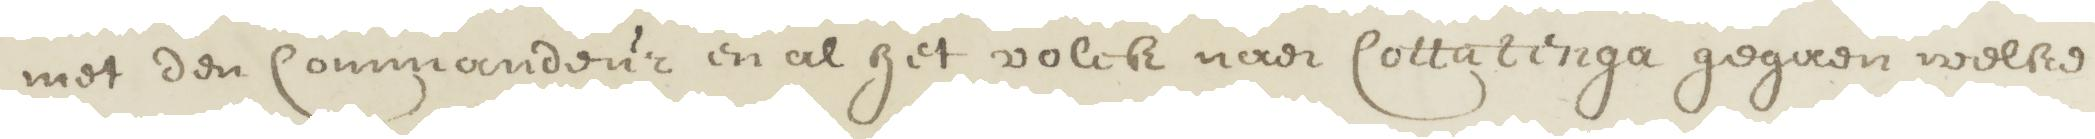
met den commandeur en al het volck naer cottatenga gegaen welke
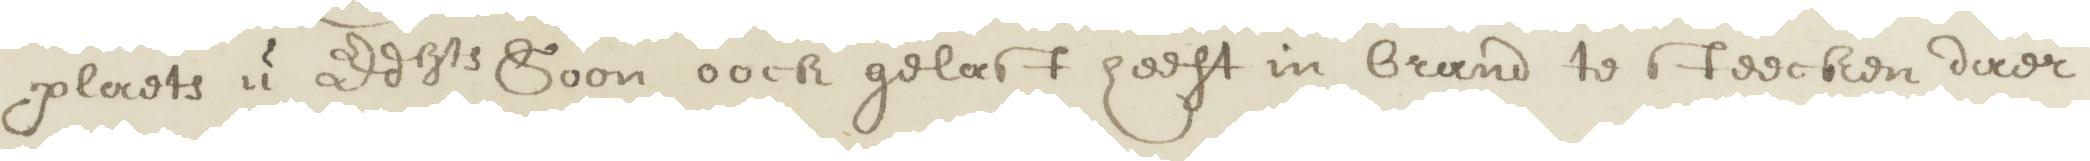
plaets u Edhts Soon oock gelast heeft in brand te steecken daer
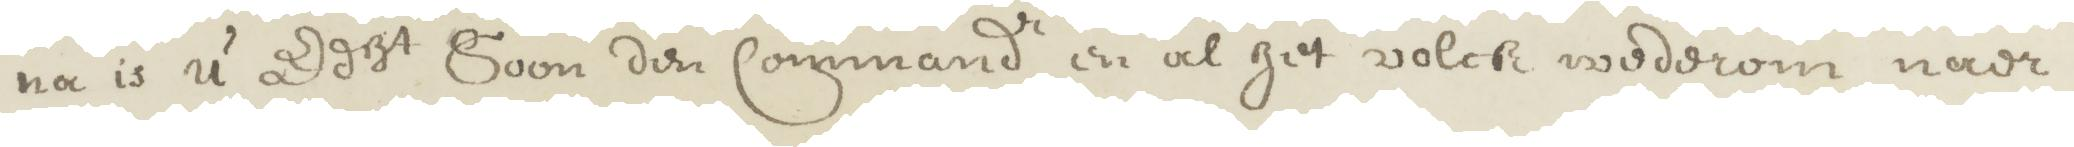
na is u Edht Soon den commandr en al het volck wederom naer
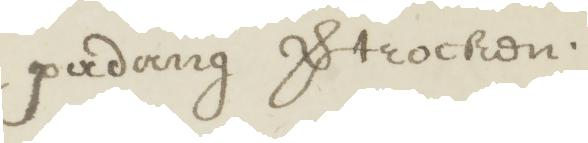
padang vertrocken.
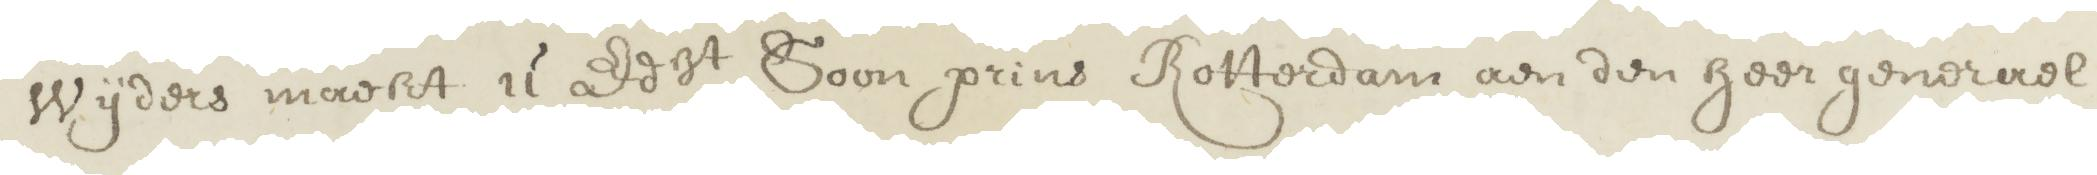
Wijders maekt u Edht Soon prins Rotterdam aen den heer generael
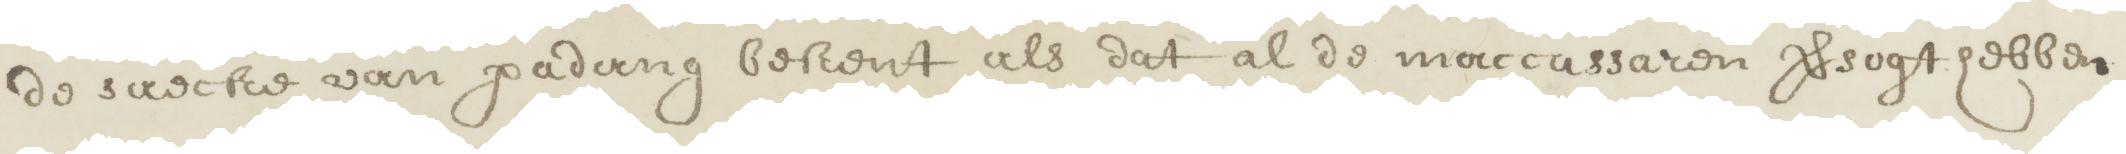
de saecke van padang bekent als dat al de maccassaren versogt hebben
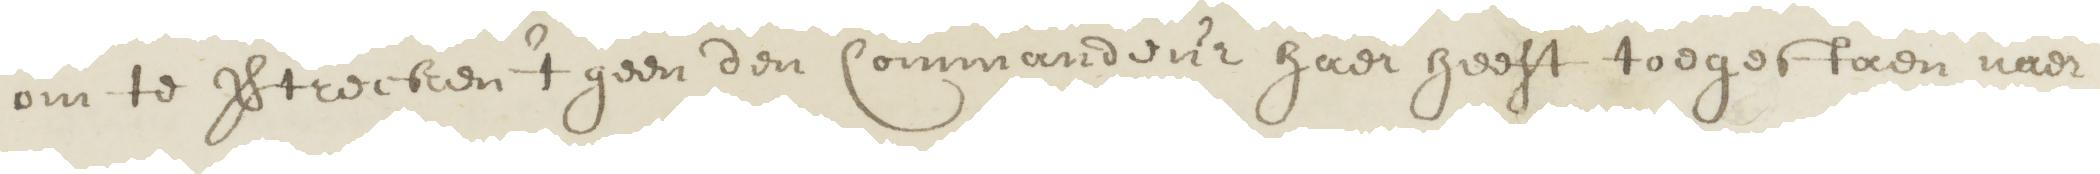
om te vertrecken ’t geen den commandeur haer heeft heeft toegestaen naer
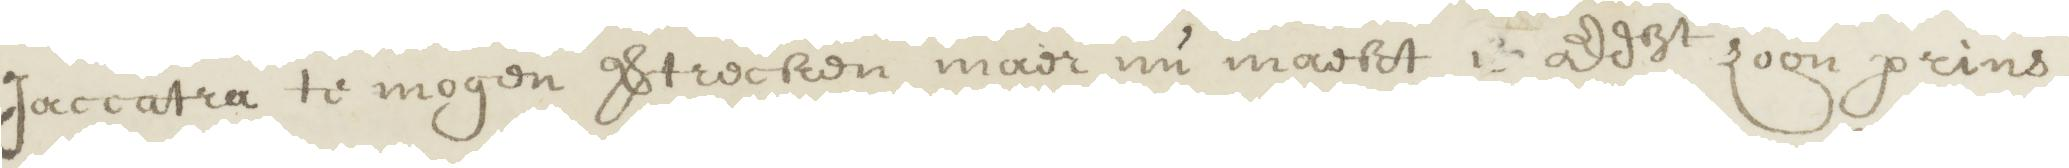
Jaccatra te mogen vertrecken maer nu maekt u Edht zoon prins
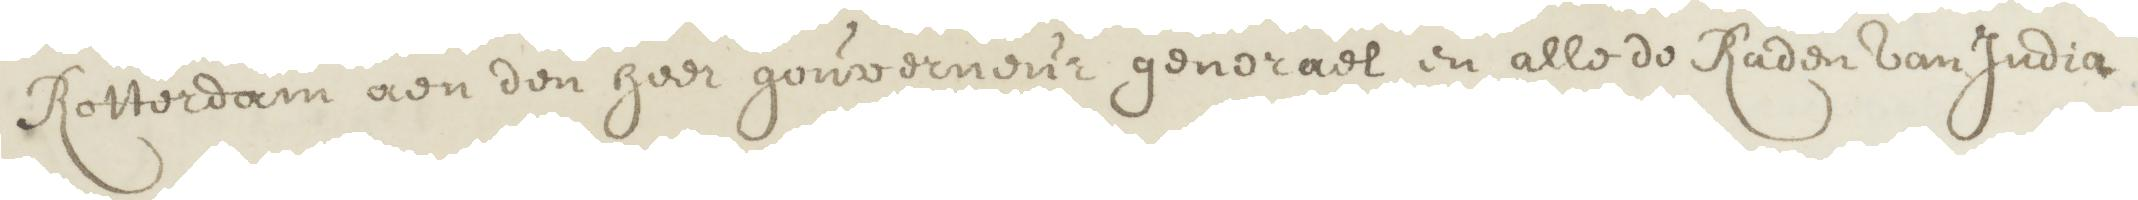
Rotterdam aen den heer gouverneur generael en alle de Raden van India
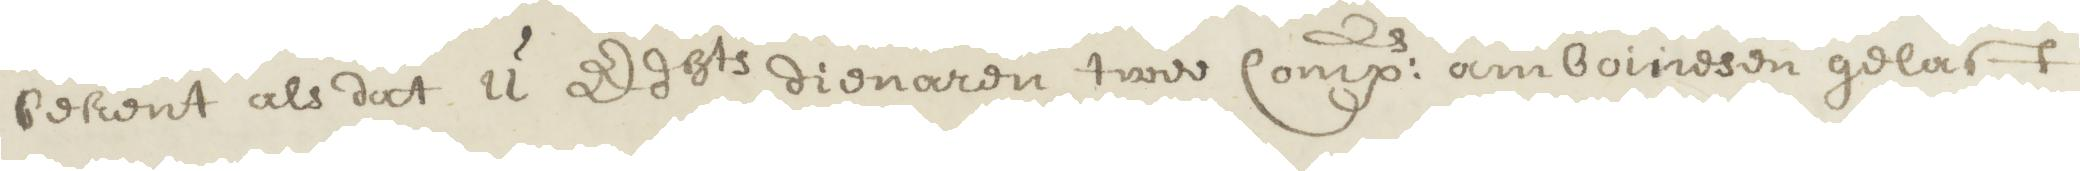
bekent als dat u Edhts dienaren twee Comp:s amboinesen gelast
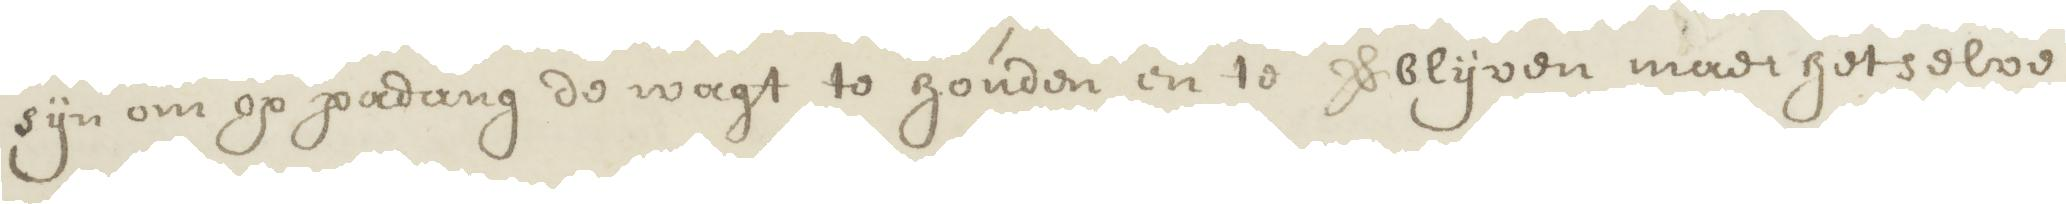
sijn om op padang de wagt te gouden en to verblijven maer het selve
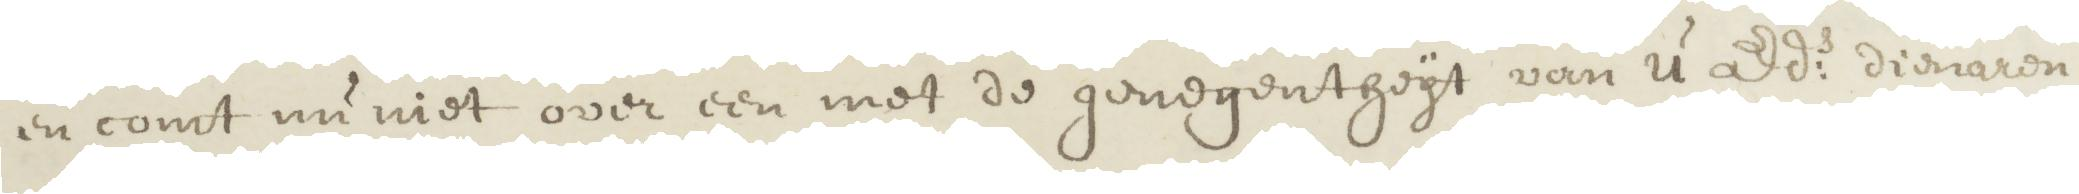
en comt nu niet over een met de genegentheijt van u Ed:s dienaren
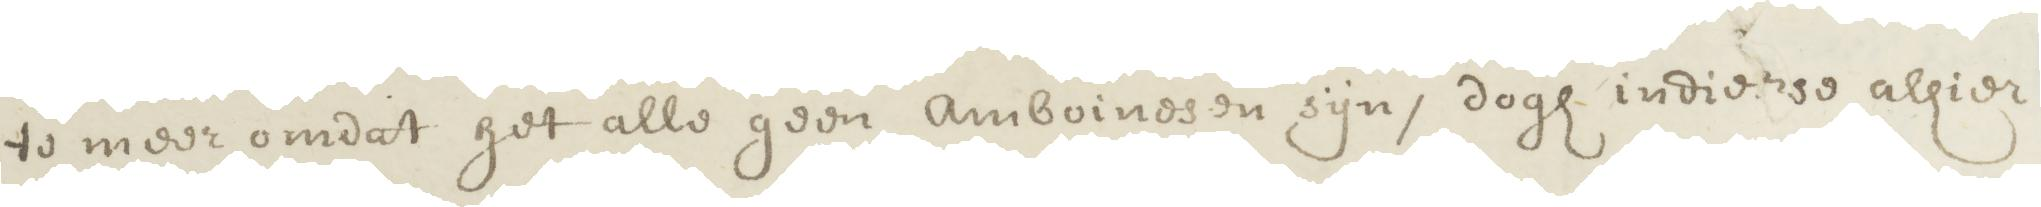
te meer omdat het alle geen amboinesen sijn, dogh indiense alhier
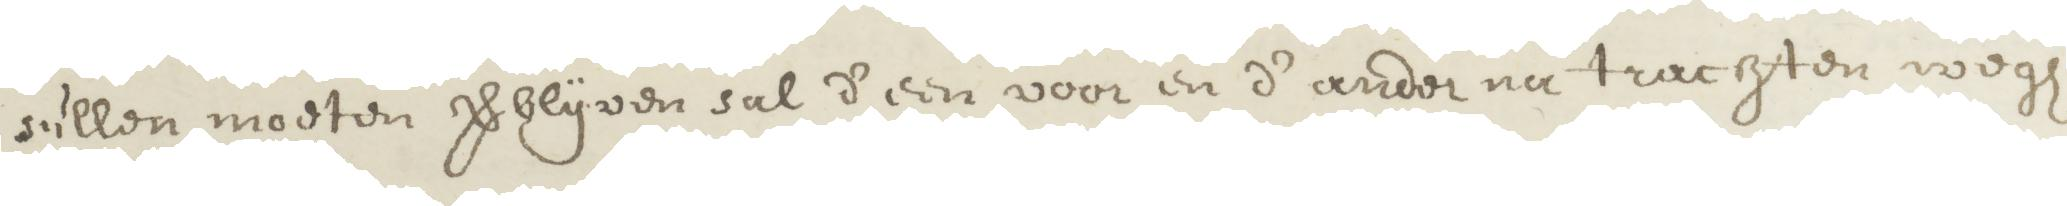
sullen moeten verblijven sal d’een voor en d’ ander na trachten wegh
